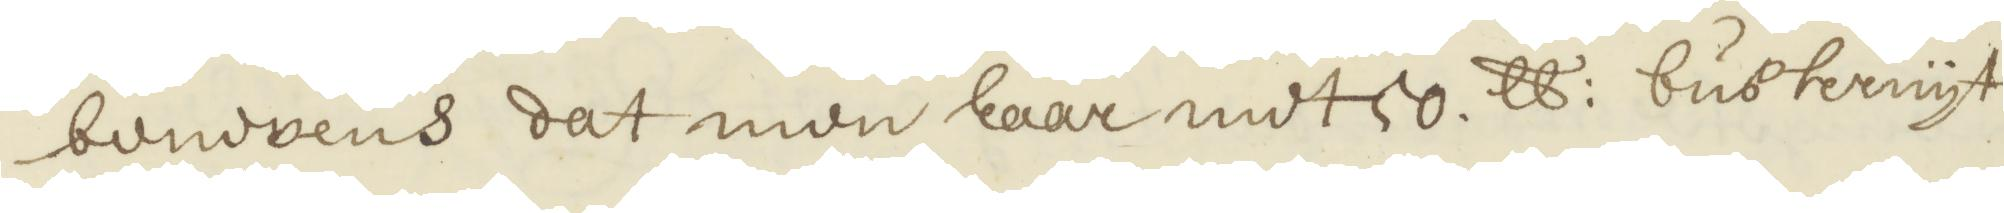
benevens dat men haar met 50. lb: buskruijt
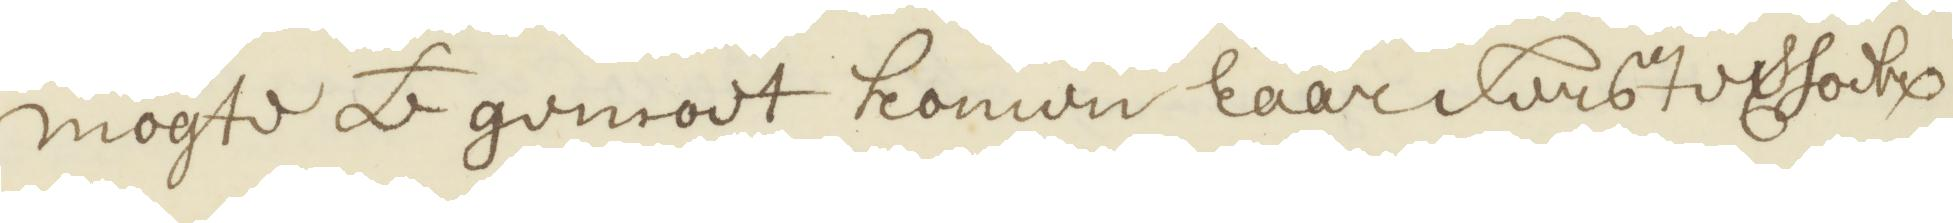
mogte te gemoet komen haar Eerste versoek
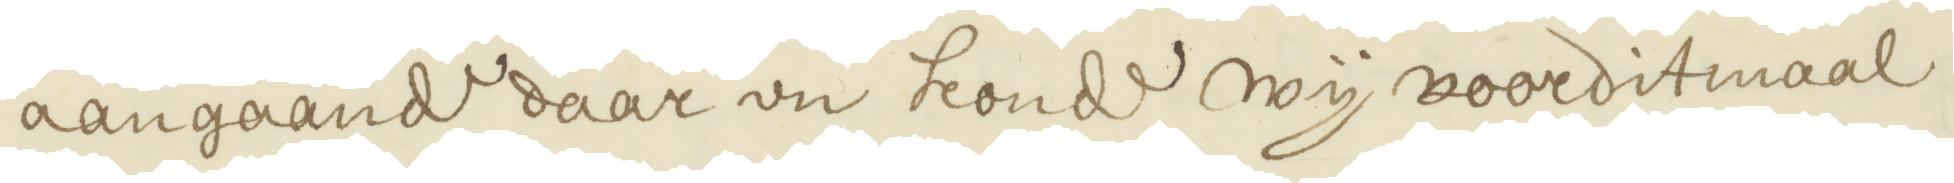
aangaande daar en konde wij voor ditmaal
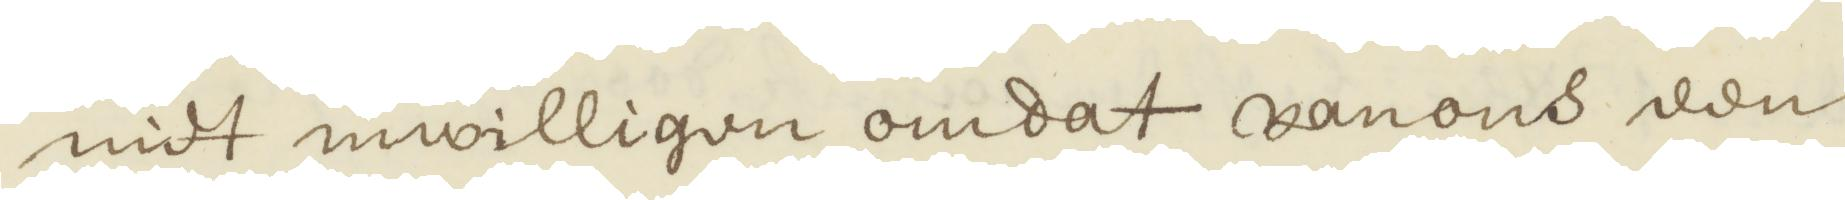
niet inwilligen omdat van ons een
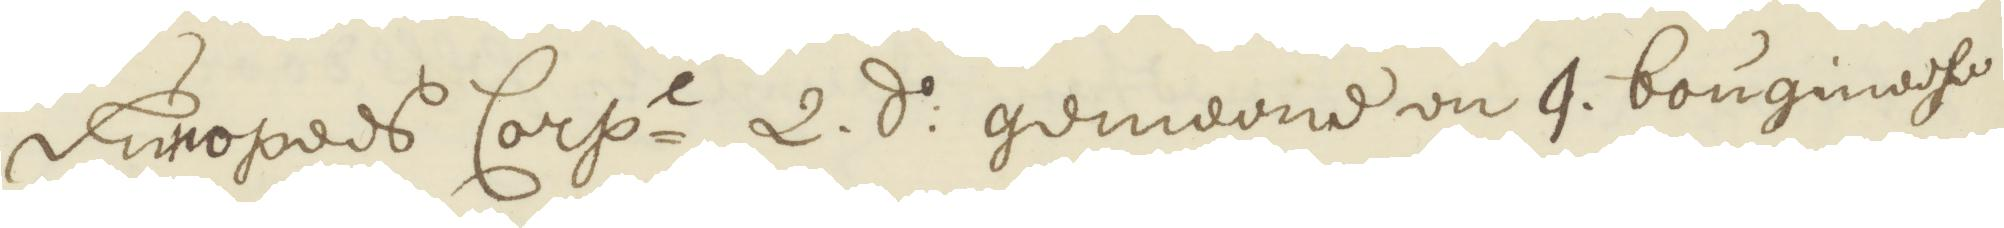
Europees Corp=l 2. d:o gemeene en 4. bougineese
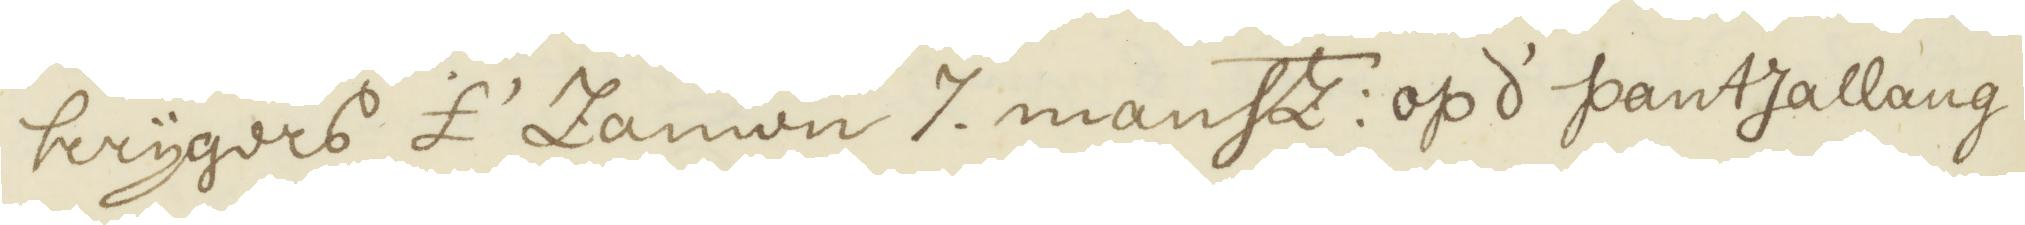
krijgers 't' Zamen 7. mansz: op d’ pantjallang
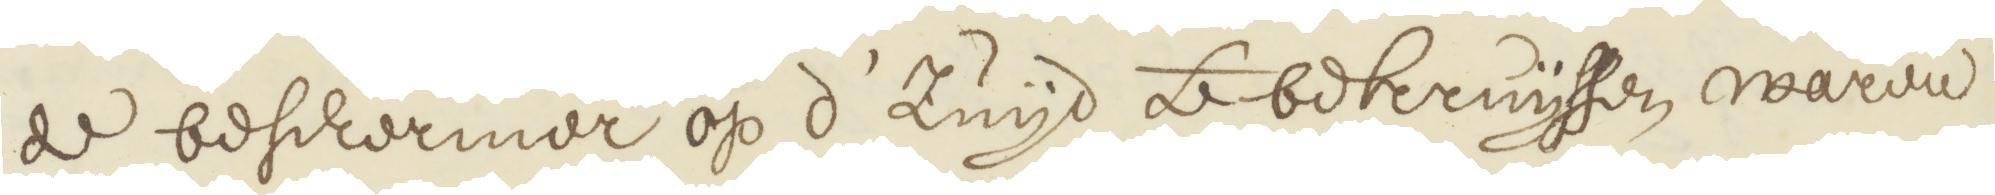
de beschermer op d’ Zuijd te bekruijssen waren
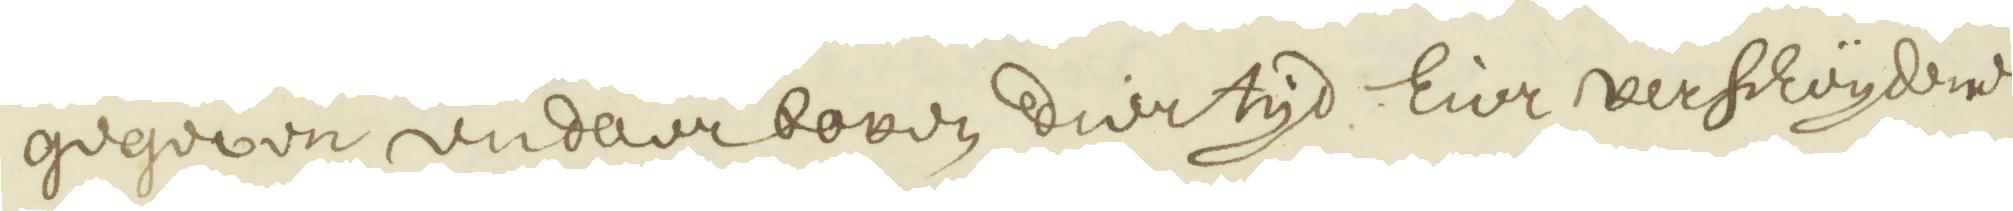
gegeven en daer boven dier tijd hier verscheijdene
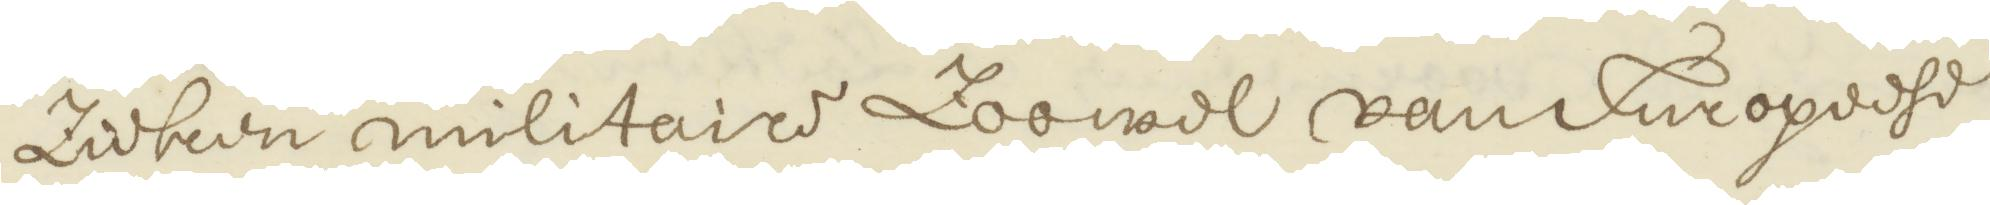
zieken militaire Zoowel van Europeese
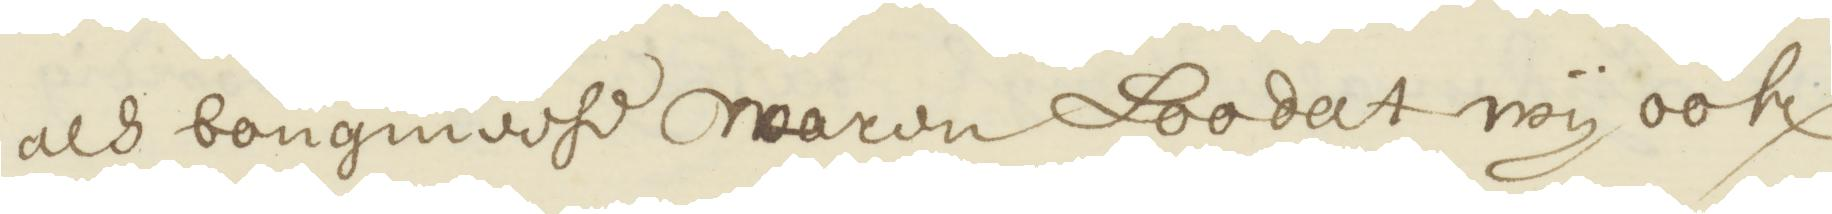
als bougineese waren Soo dat wij ook
